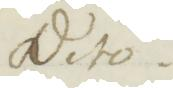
Dito. . . . . . . . .
